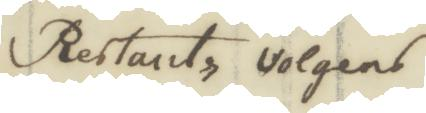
Restanten volgens
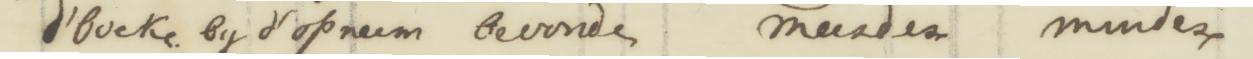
d'boeke by d’opneem bevonden meerder minder
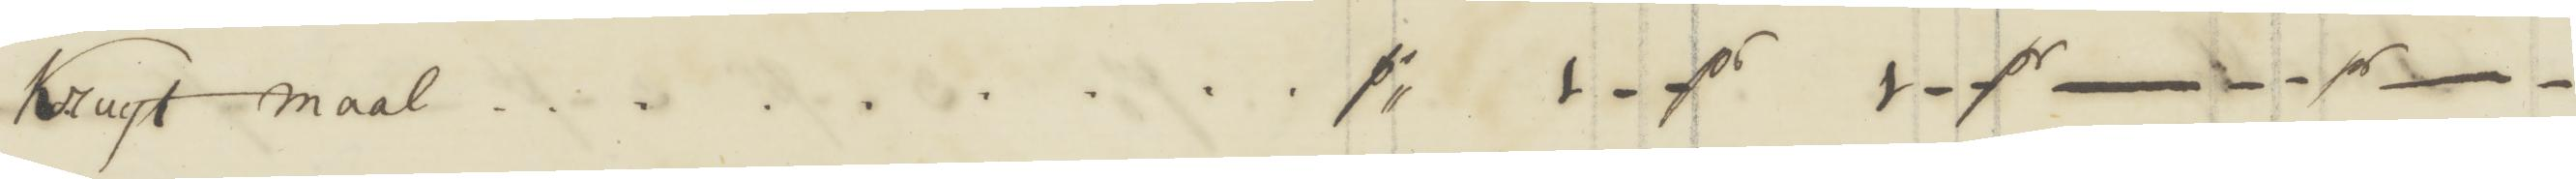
Kruyt maal p„s 1– - ps 1– ps — – – ps — –
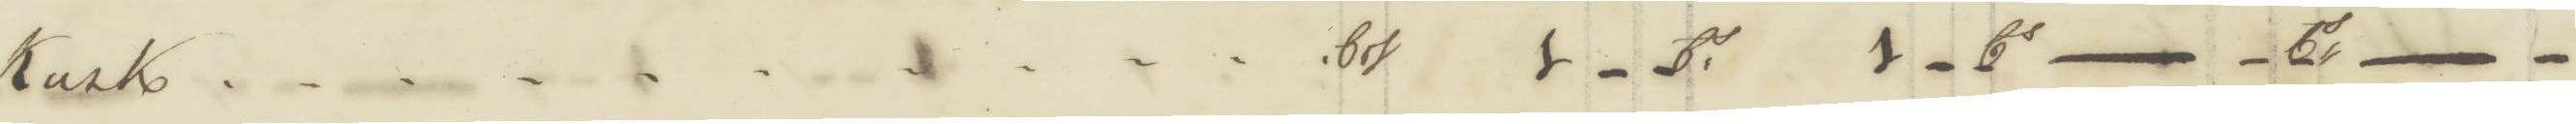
Kurk bos 1–b.s 1–bs — – b„s — –
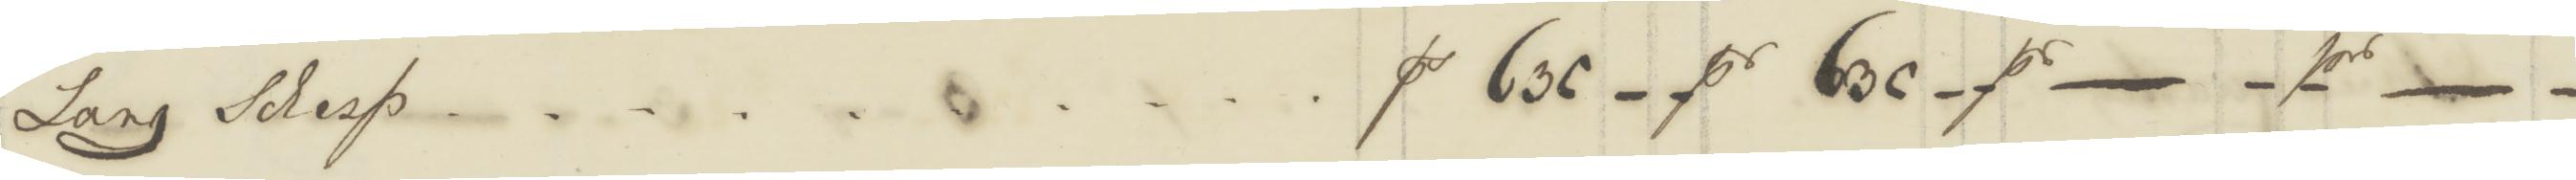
Lang scherp ps 635–ps 635 – - ps — –ps– — –
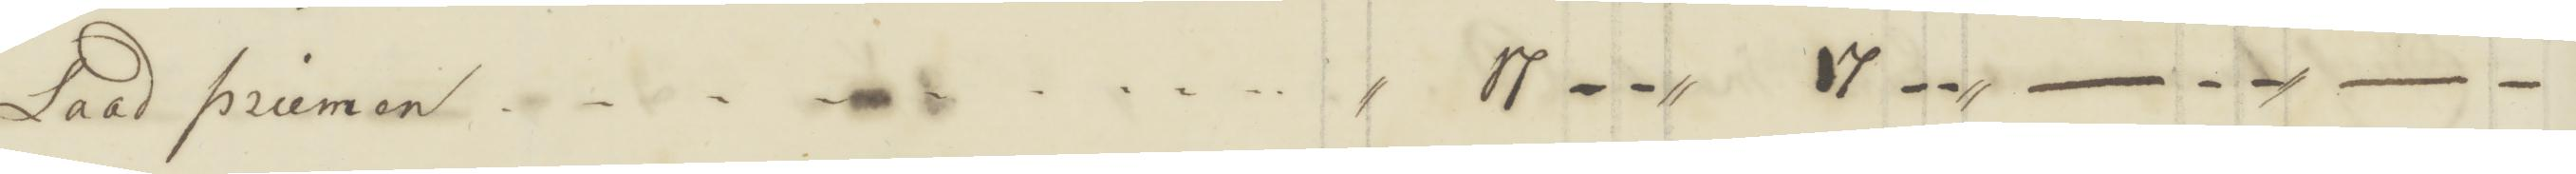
Laad priemen „ 17– –„ 17– –„ — – –„— –
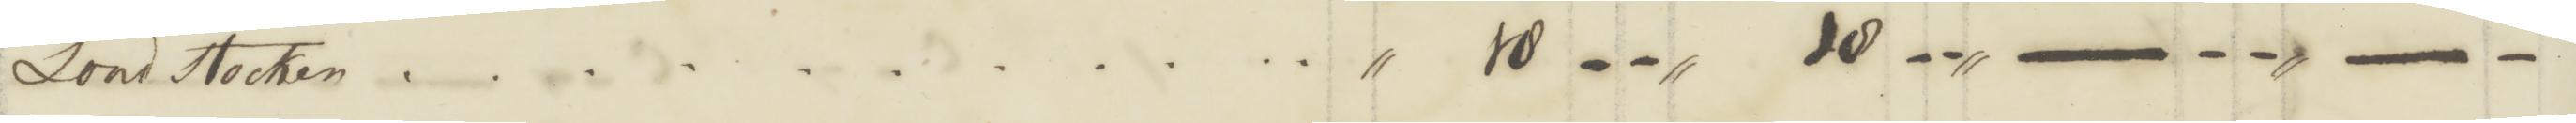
Lond stocken „ 18– –„ 18 – –„ — – –„— –
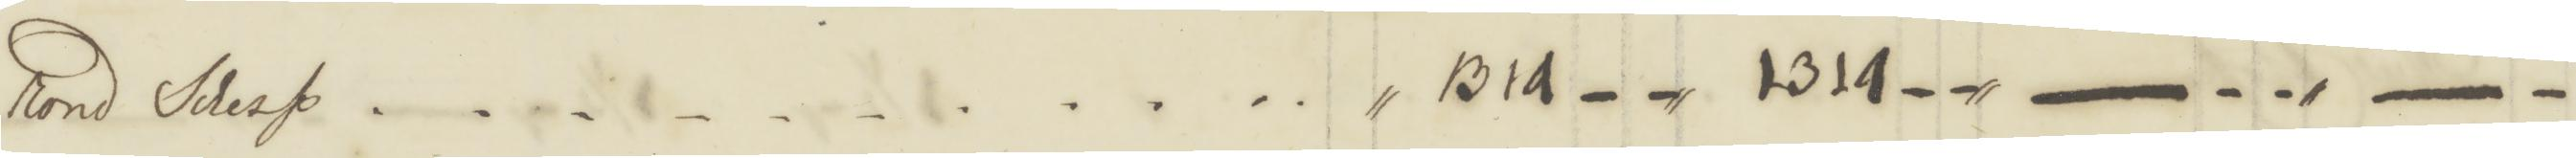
rond scherp „ 1314 – –„ 1314 – –„ — – –„— –
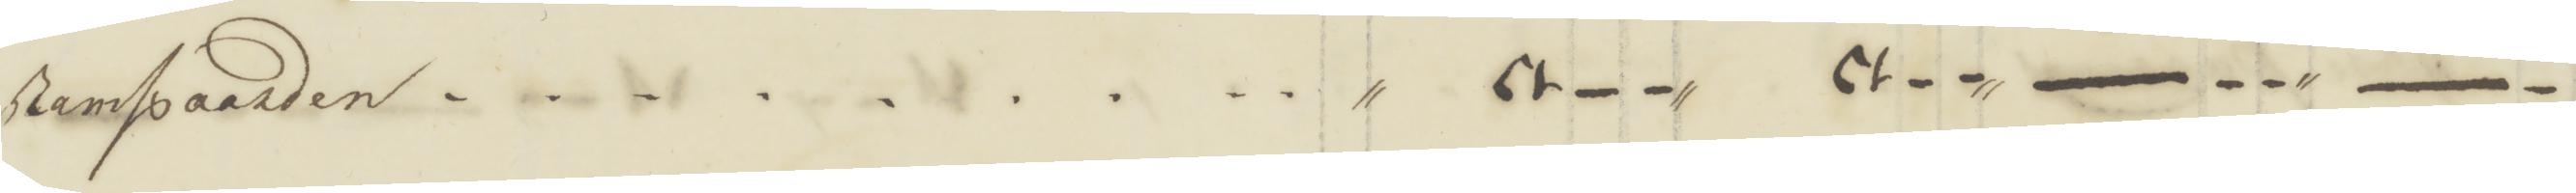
rampaarden „ 51 – –„ 51 – –„ — – –„— –
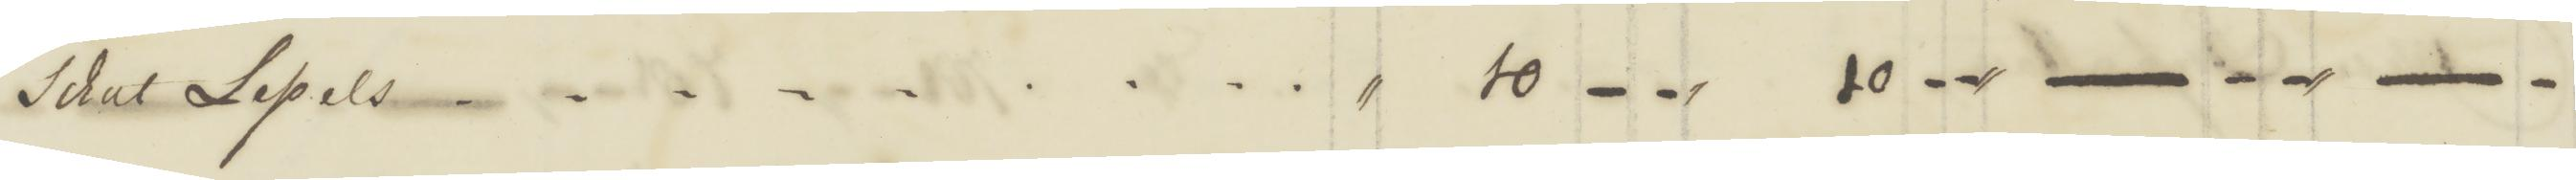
schut Lepels „ 10 – –„ 10 – –„— – –„— –
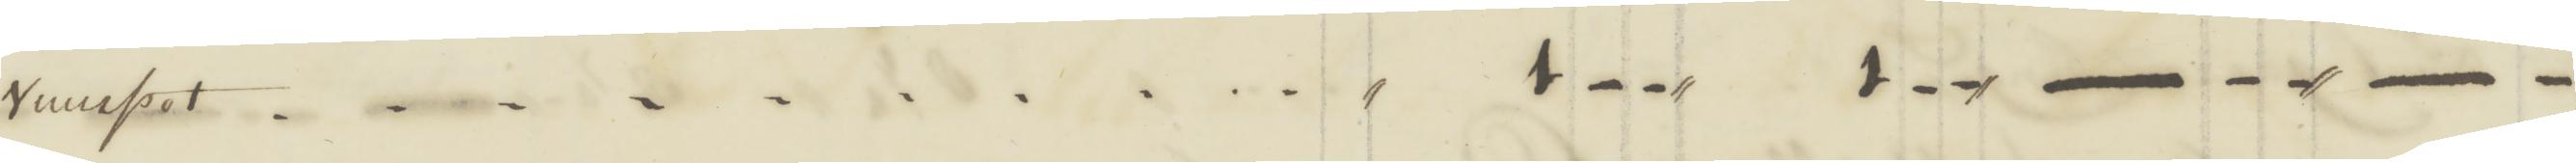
Vuurpot – 1 – –„ 1 – –„ — – –„— –
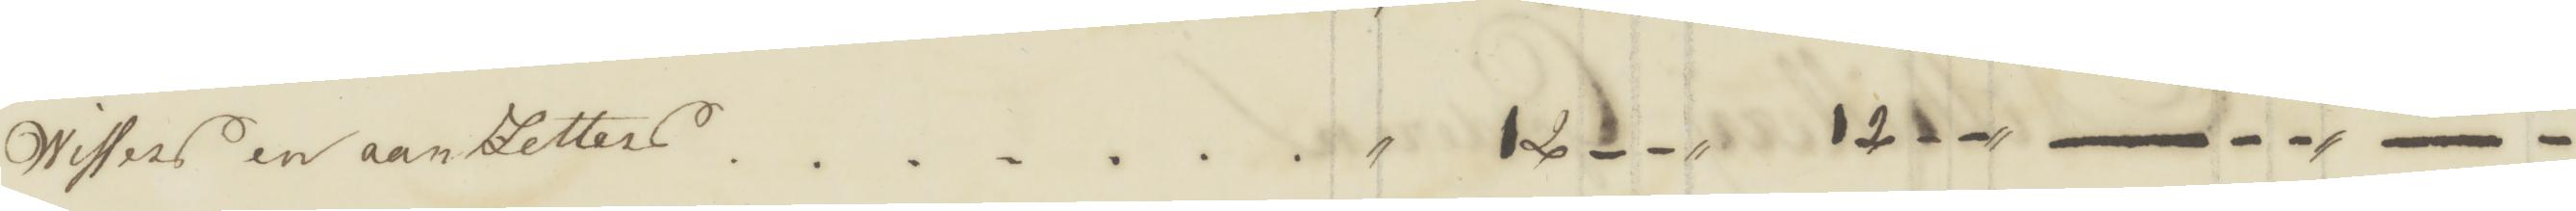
Wissers en aanzetters „ 12 – –„ 12 – –„— – –„— –
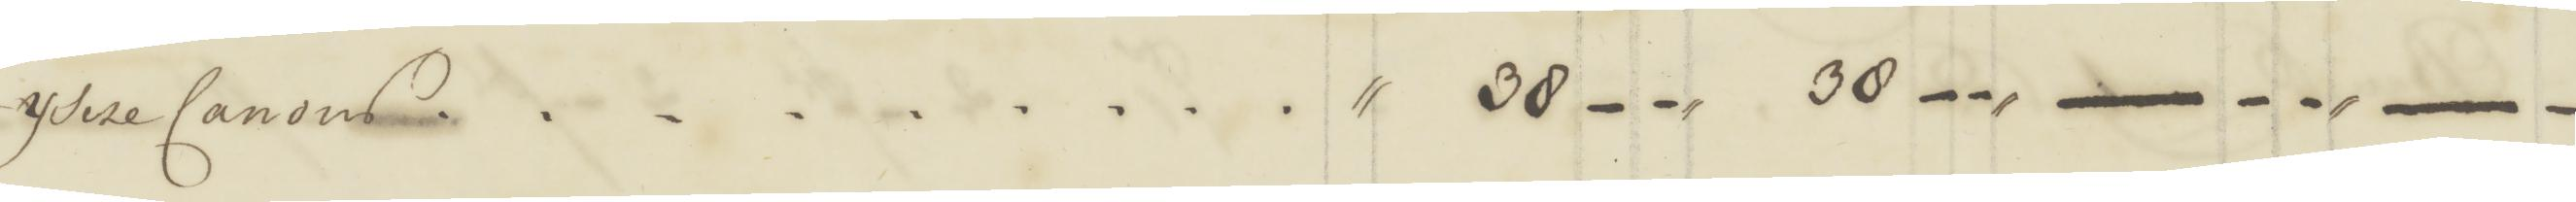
Ysere Canons „ 38 – –„ 38 – –„— – –„— –
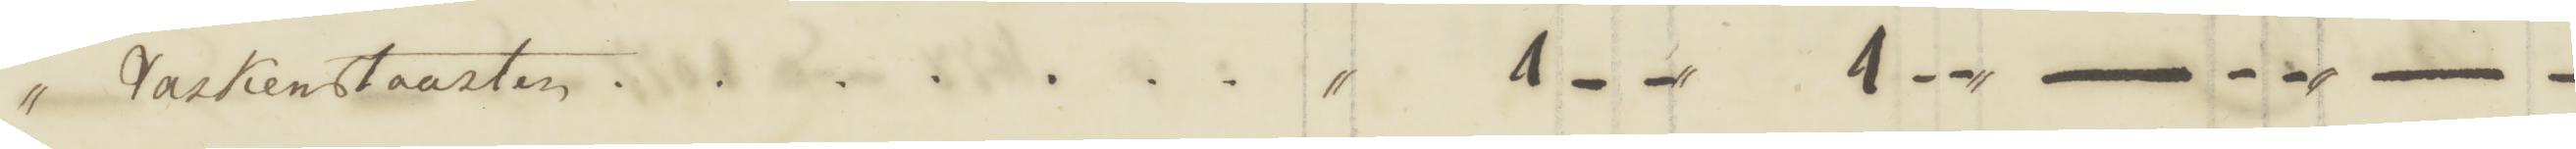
„ Varkenstaarten „ 4 – –„ 4 – –„— – –„— –
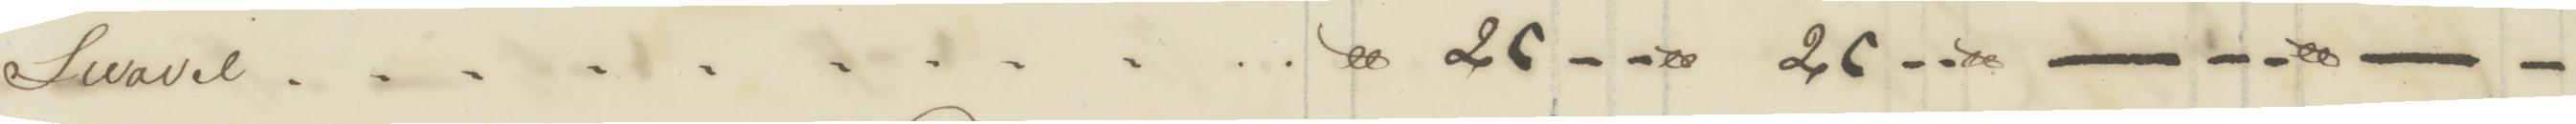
Swavel lb 25 – –lb 25 – –lb – –lb
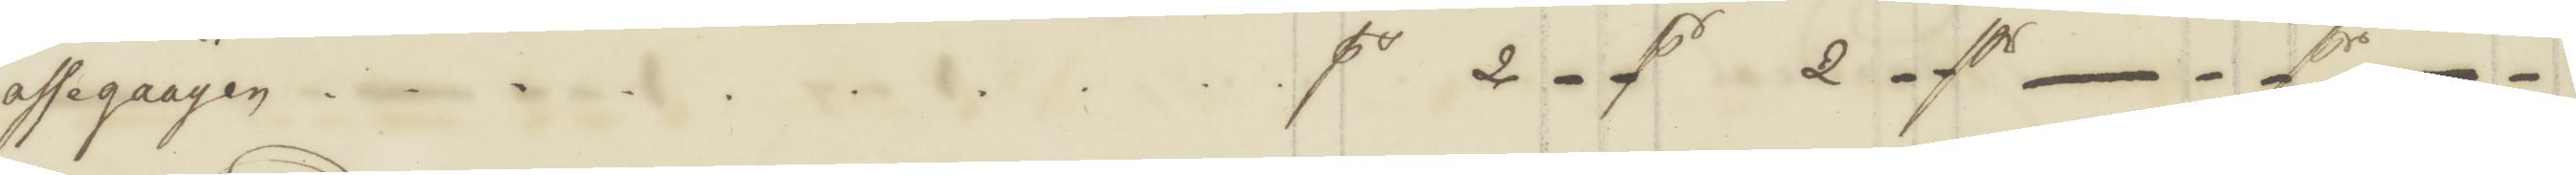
assegaaijen ps 2 – - ps 2 – - pr — - - ps — -
